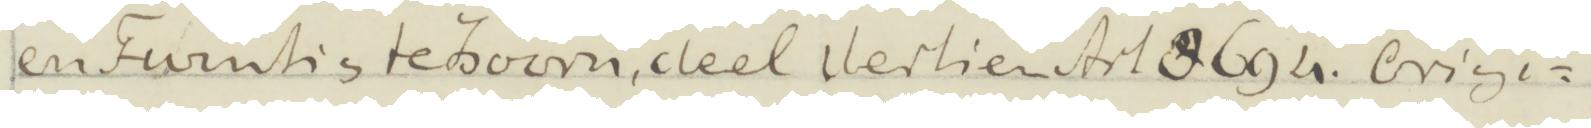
en Twintig te hoorn, deel dertien Art 8694. Origi=
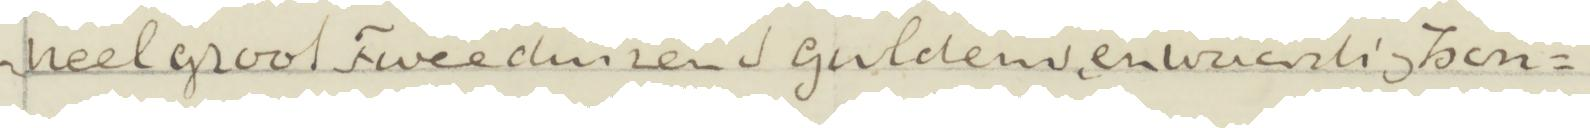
=neel groot Tweeduizend guldens en waardig hon=
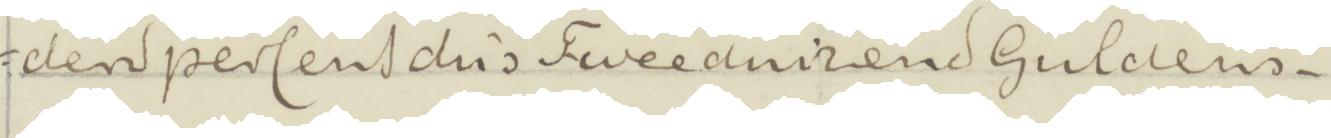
=derd percent dus Tweeduizend Guldens - - - - - „ 2000 „ —
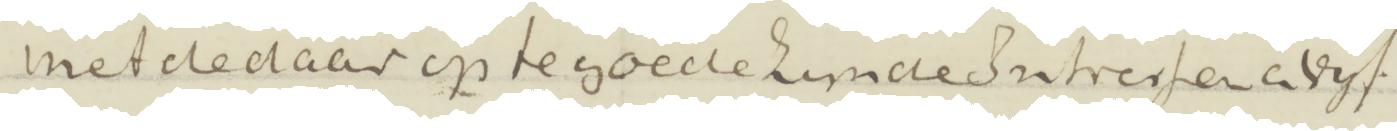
met de daar op te goede zynde Jntressen a vyf
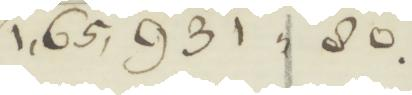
ƒ1,65,931 „ 80.
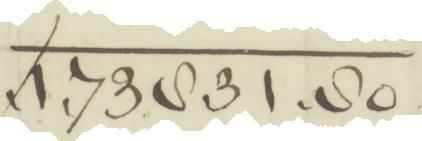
ƒ1,73831,80.
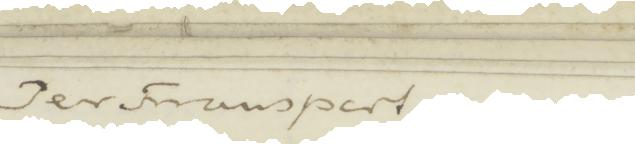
Per Transport - - - - - ƒ1,7,3,831 „ 80
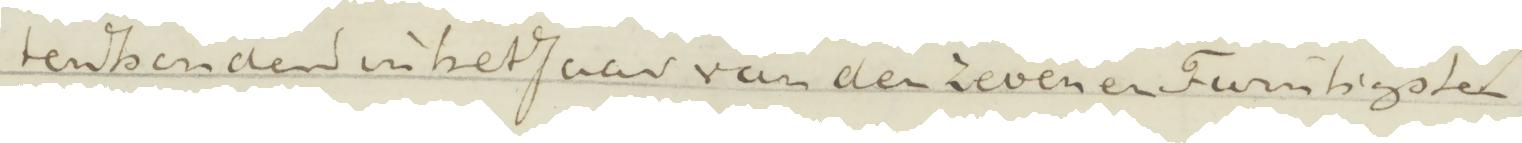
ten honderd in het Jaar van den zeven en twintigsten
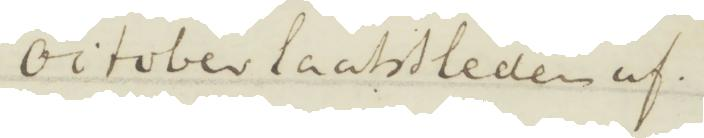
October laatstleden af.
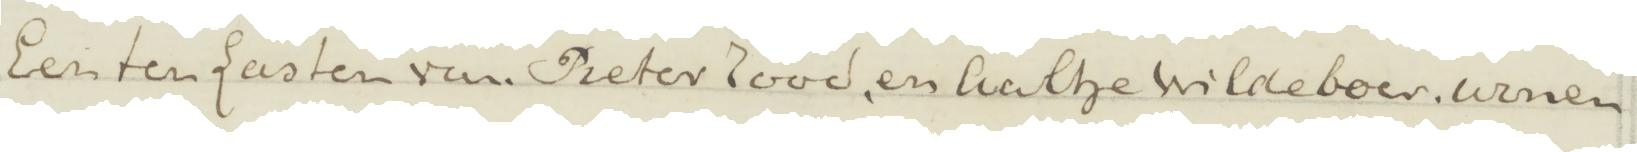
Een ten Lasten van Pieter rood, en Aaltje wildeboer. wonen
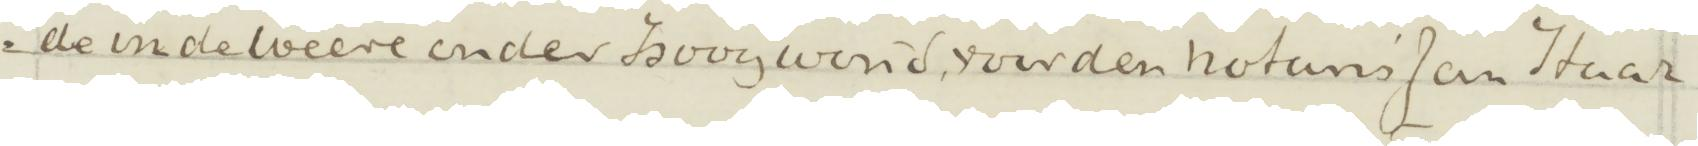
-de in de weere onder hoogwoud, voor den Notaris Jan Haar
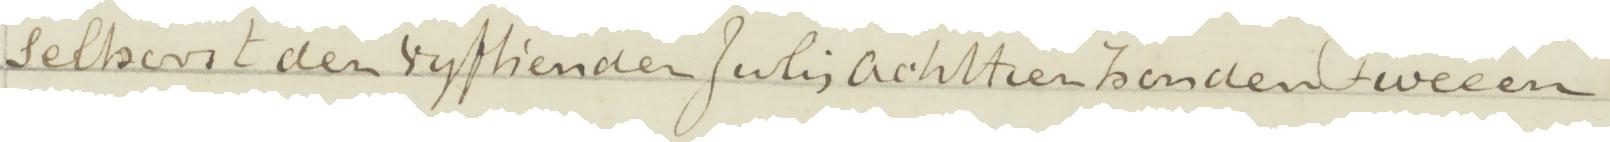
selhorst den vyftienden Julij achttien honderd Twee en
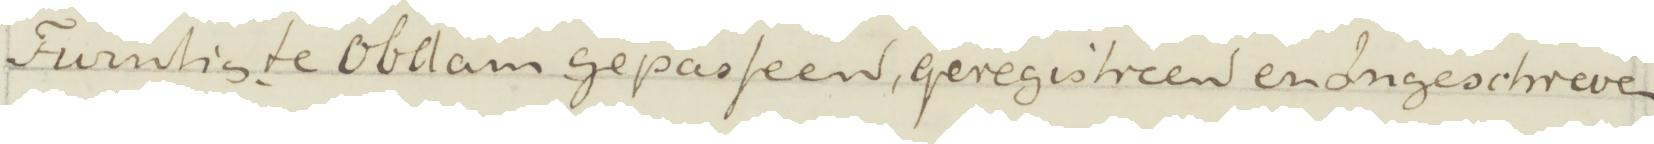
Twintig, te Obdam gepasseerd, geregistreerd en Jngeschreven
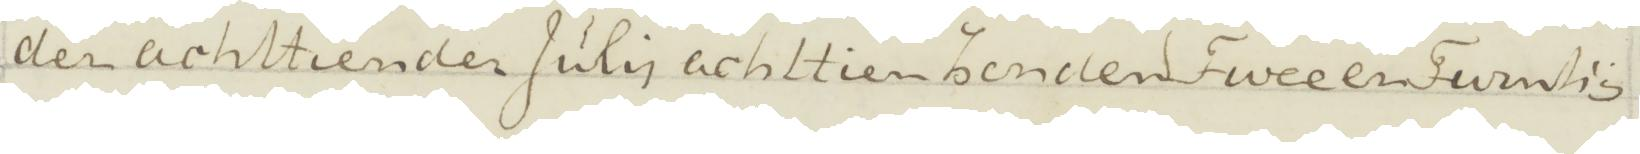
den achttienden Julij achttien honderd Twee en Twintig
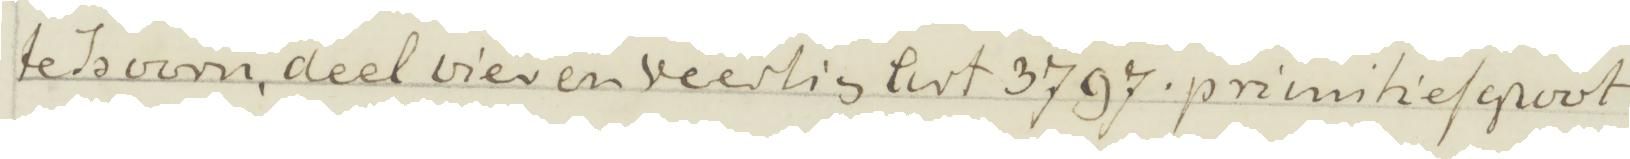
te hoorn, deel vier en veertig Art 3797. primitief groot
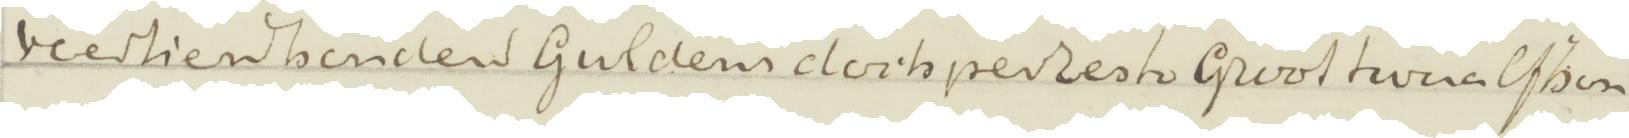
veertien honderd Guldens doch per resto Groot twaalf hond
